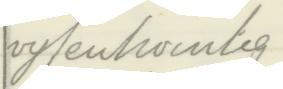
vyf entwintig
